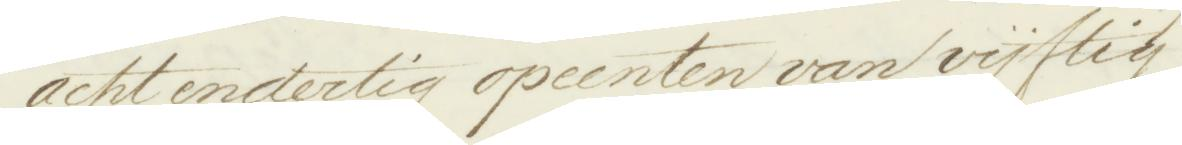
acht en dertig opcenten van vijftig
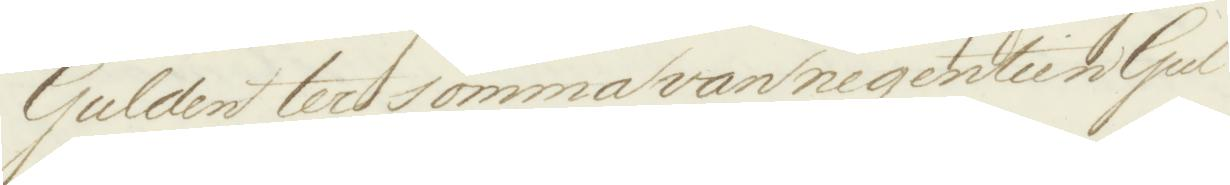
Gulden ter somma van negentien Gul
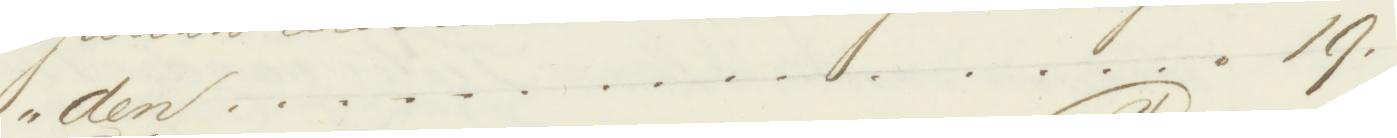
„ den . . . . - . . . . . . . . . . „ 19.
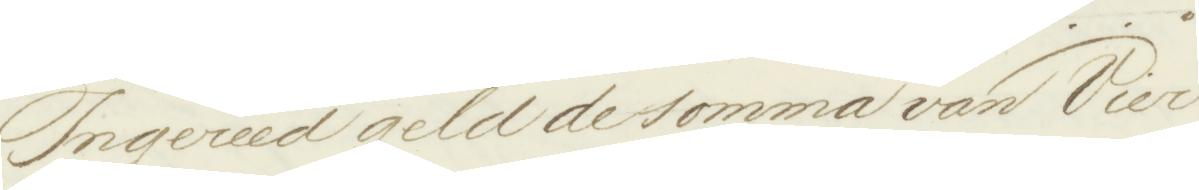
In gereed geld de somma van Vier
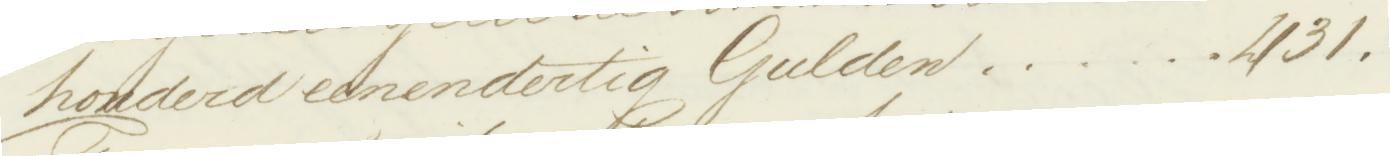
honderd eenendertig Gulden . . . . . . 431.
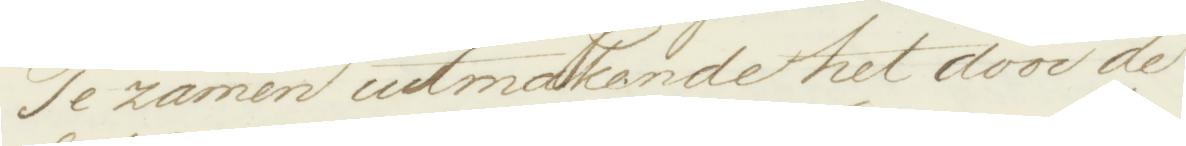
Te zamen uitmakende het door de
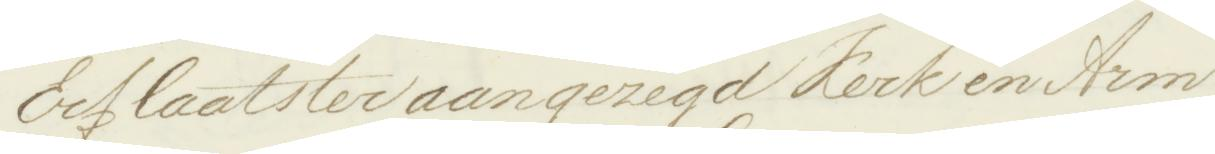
Erflaatster aangezegd Kerk en Arm
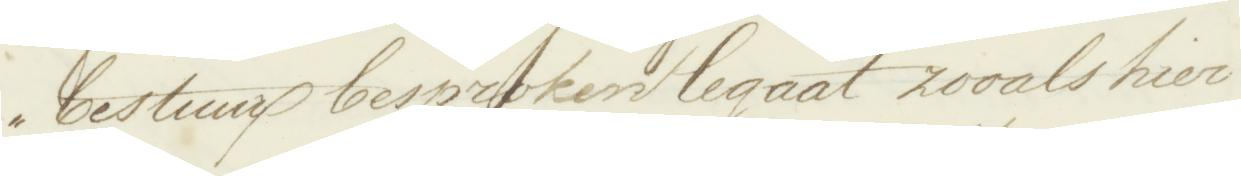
„bestuur besproken legaat zoo als hier
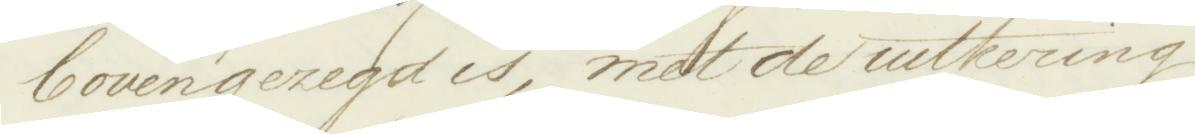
bovengezegd is, met de uitkering
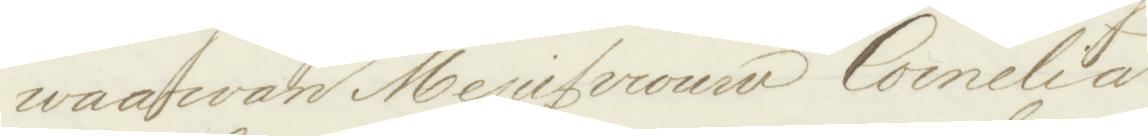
waarvan Mejufvrouw Cornelia
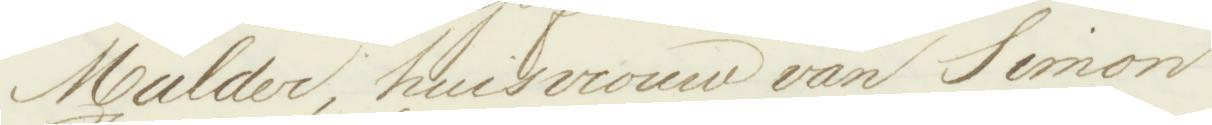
Mulder, huisvrouw van Simon
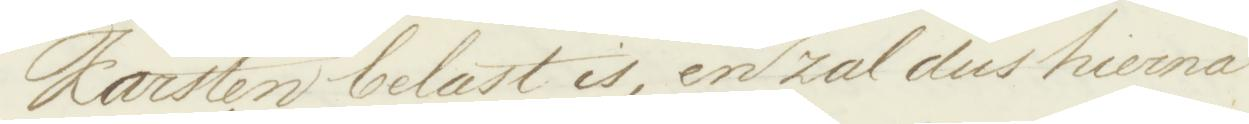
Karsten belast is, en zal dus hierna
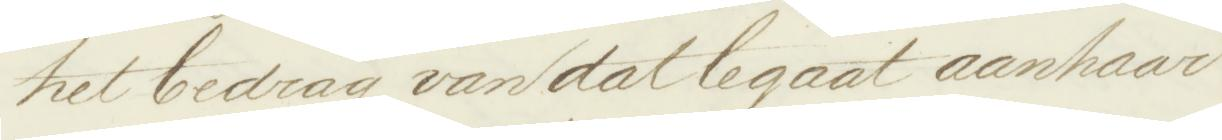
het bedrag van dat legaat aan haar
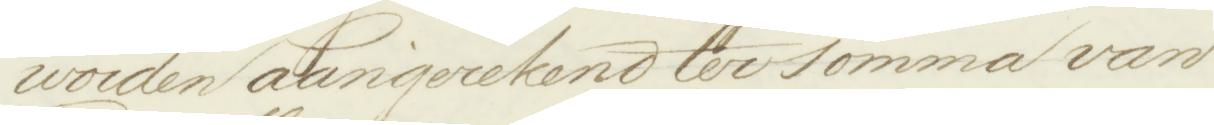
worden aangerekend ter somma van
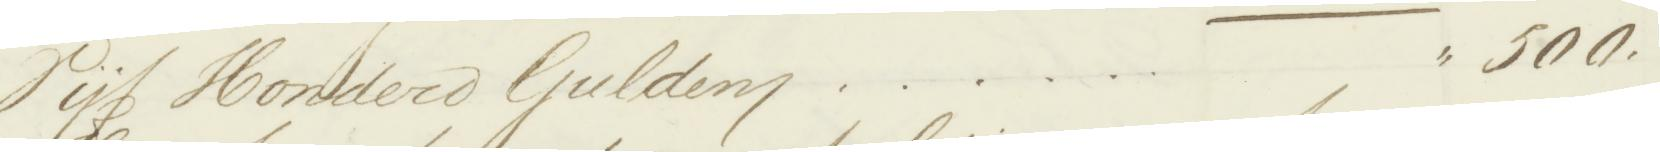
Vijf Honderd Guldens . . . . . . „ 500.
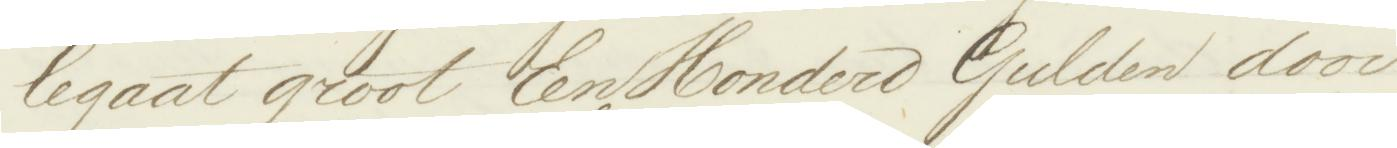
legaat groot Een Honderd Gulden door
